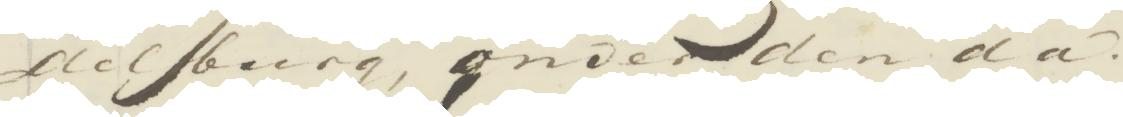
„delburg, onder den da„
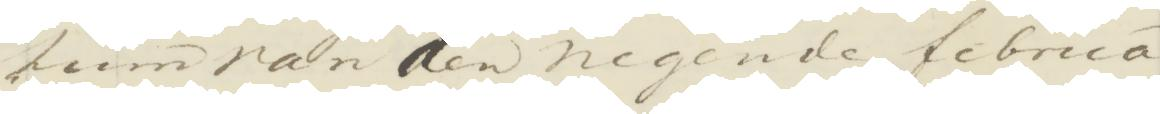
tum van den negenden februa
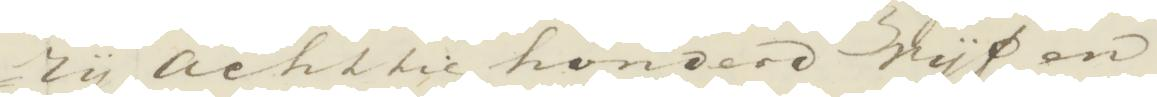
„rij achttien honderd vijf en
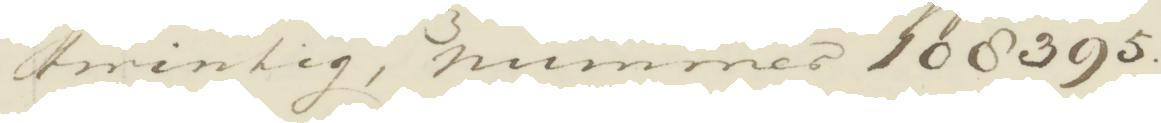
twintig, Nummer 108395
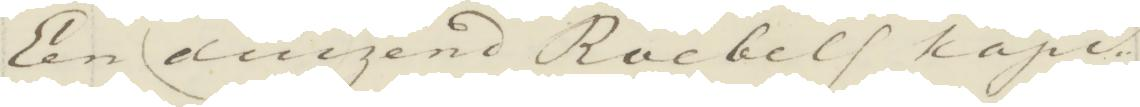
Een duizend Roebels kapi„
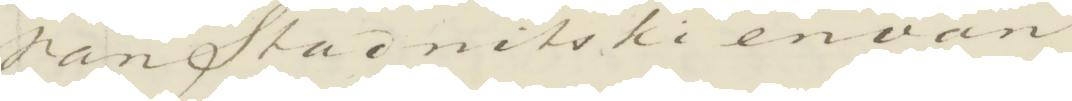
Van Stadnitski en van
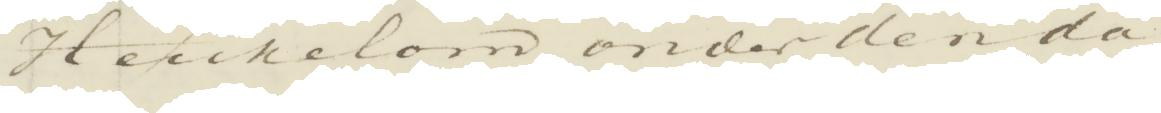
Heukelom, onder den da
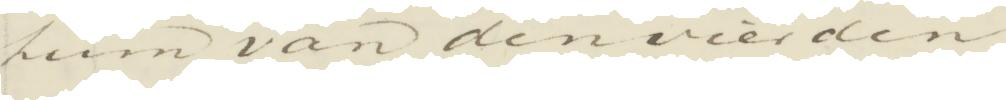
tum van den vierden
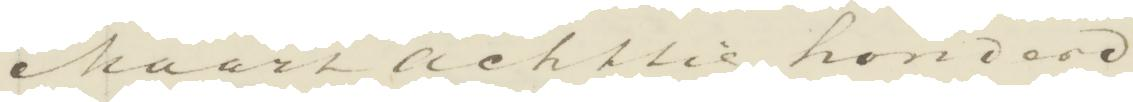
Maart achttien honderd
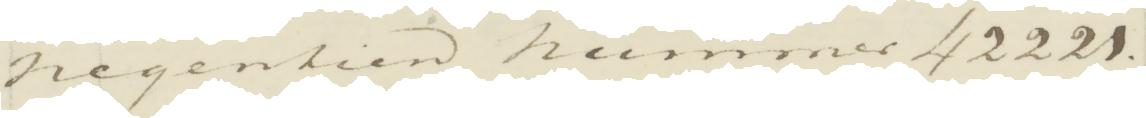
negentien Nummer 42221.
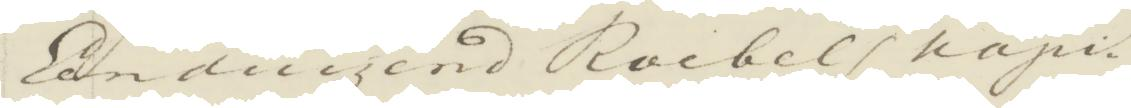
Een duizend Roebels, kapi„
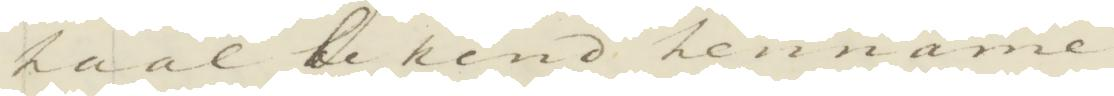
taal bekend tenname
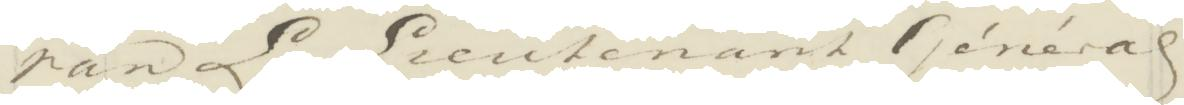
van Le Lieutenant Général
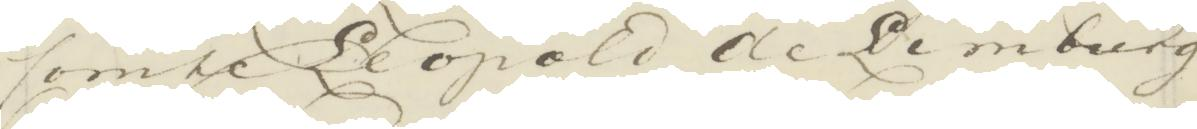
Comte Leopold de Limburg
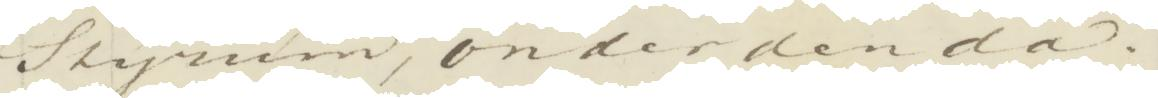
Stijrum, onder den da„
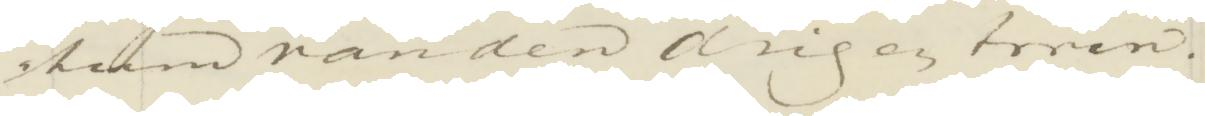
tum van den drie en twin„
